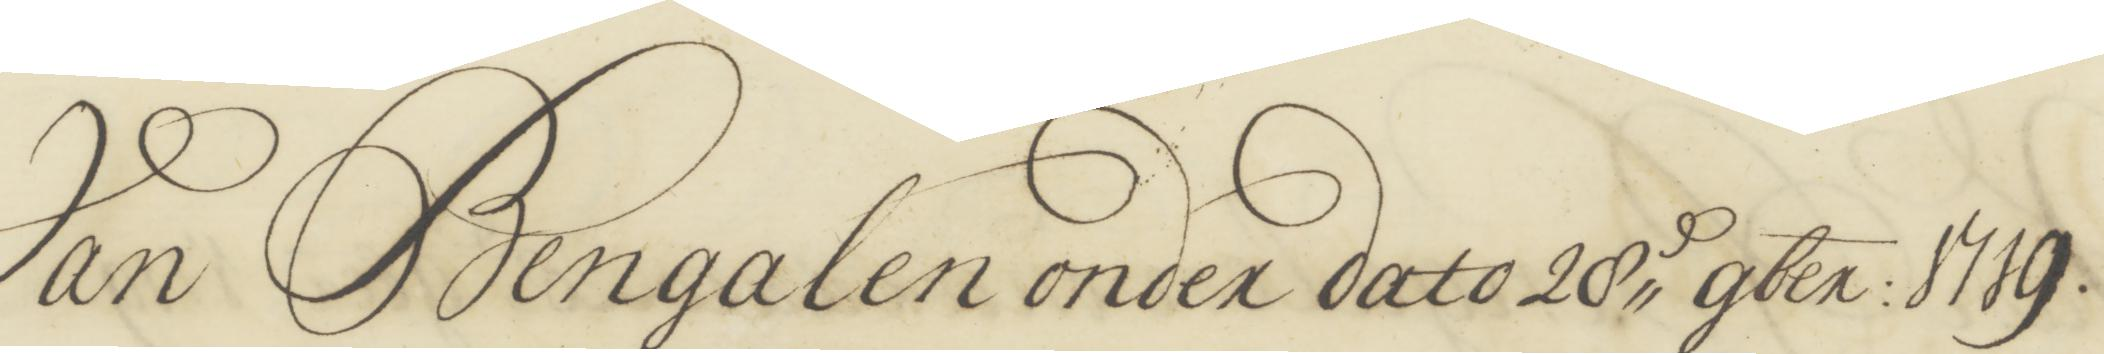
Van Bengalen onder dato 28„e 9ber: 1719.
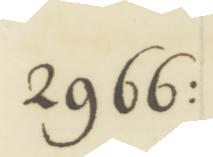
2966:
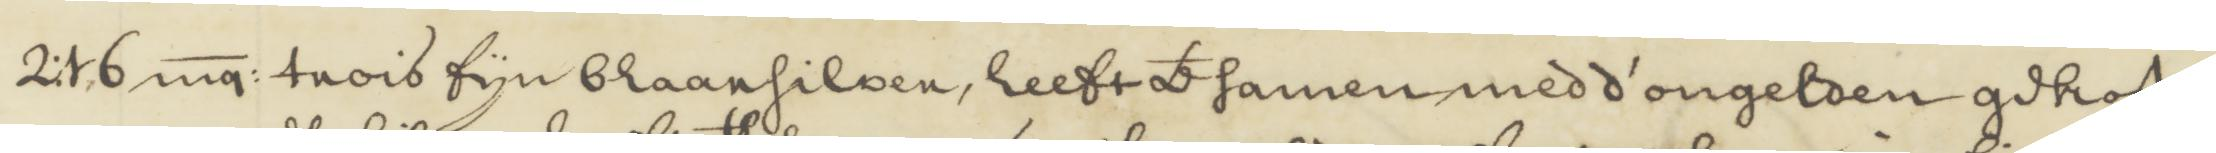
2:1,6 mq: trois fijn bhaarsilver, heeft tesamen med d’ongelden gekost
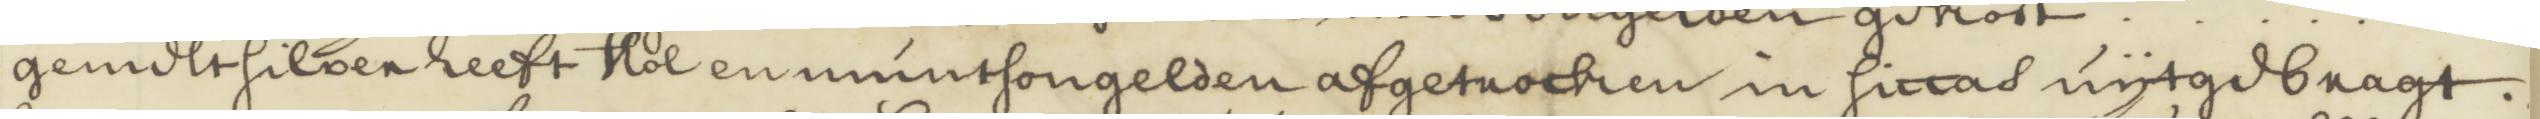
gemelt silver heeft thol en muntsongelden afgetrocken in siccas uijtgebragt.
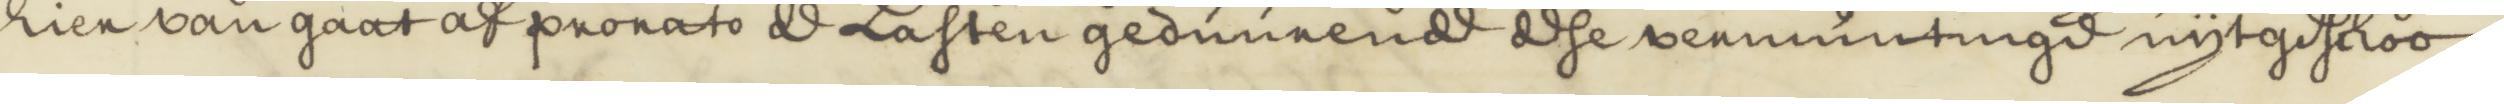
hier van gaat af prorato de Lasten geduurende dese vermuntinge uijtgeschoo=.
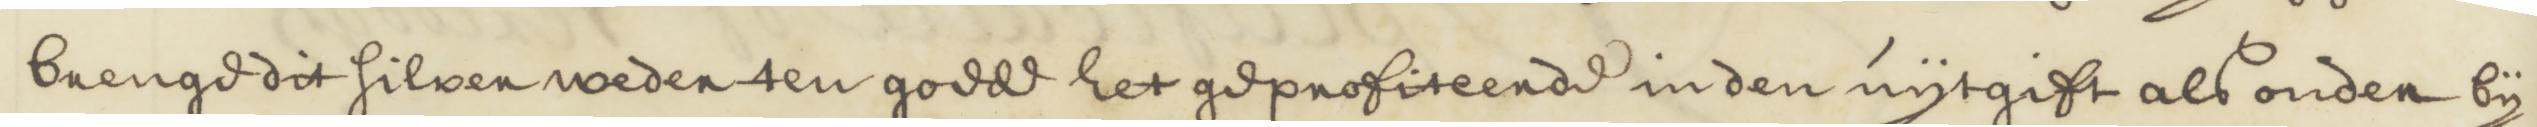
brenge dit silver weder ten goede het geprofiteerde in den uijtgift als onder bij
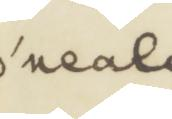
d'real
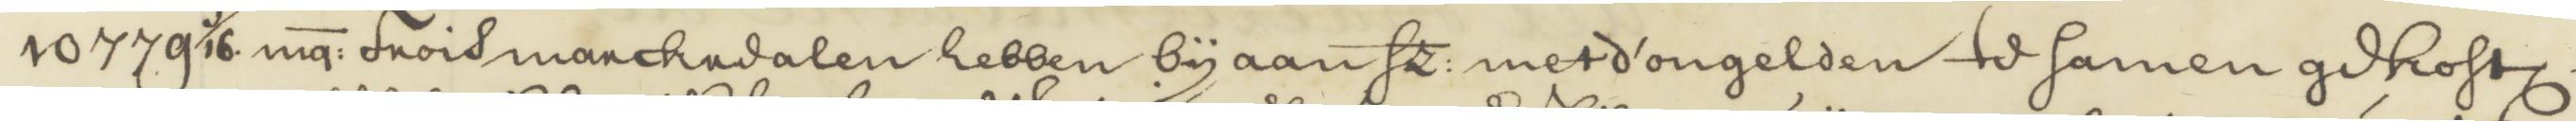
10779 3/16. mq: Trois marckrealen hebben bij aansz: met d’ongelden te samen gekost
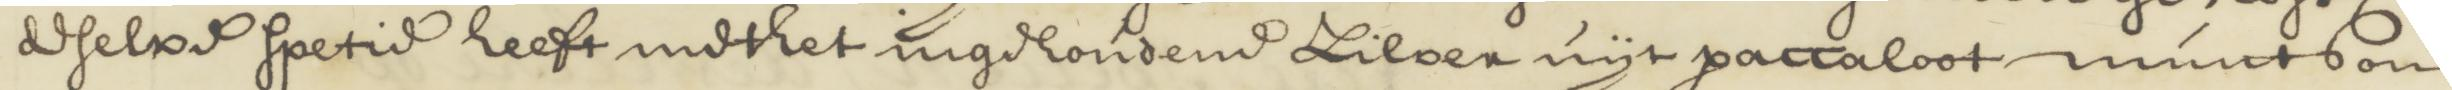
deselve spetie heeft met het ingehoudene zilver uijt paccaloot munts on
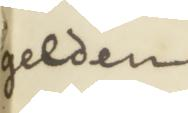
gelden
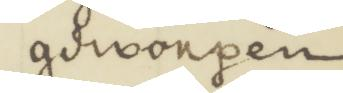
geworpen
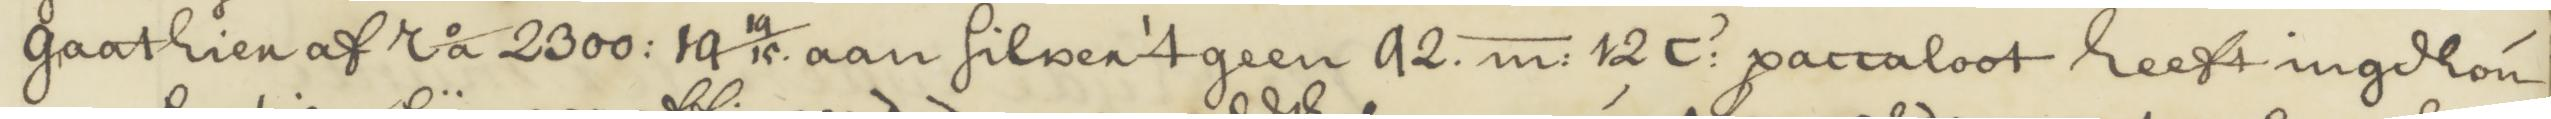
gaat hier af ro/a 2300: 14 14/15. aan silver ’t geen 42. m: 12c:' paccaloot heeft ingehou
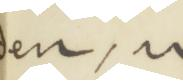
den,
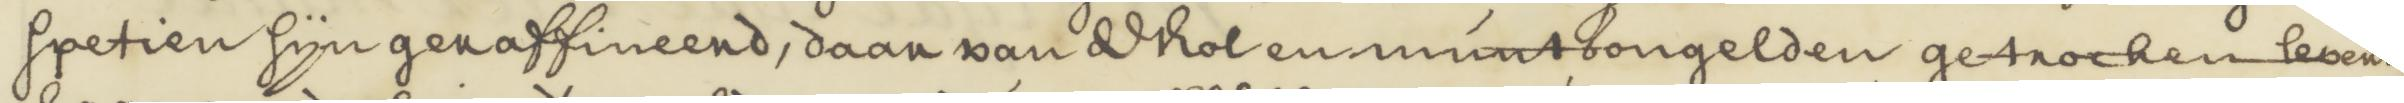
spetien sijn geraffineerd, daar van de thol en muntsongelden getrocken levert
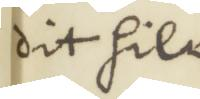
dit sil
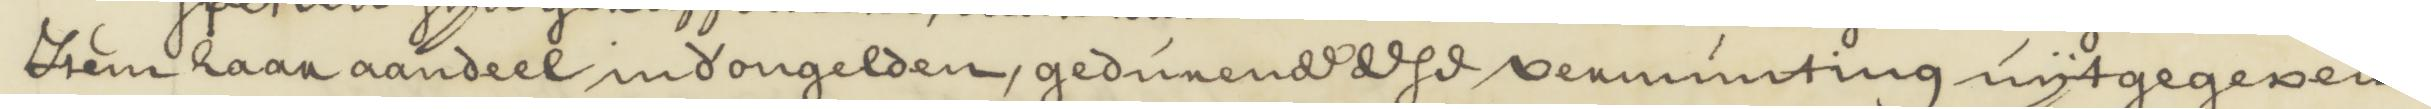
Item haar aandeel in d'ongelden, gedurende dese vermunting uijtgegeven
